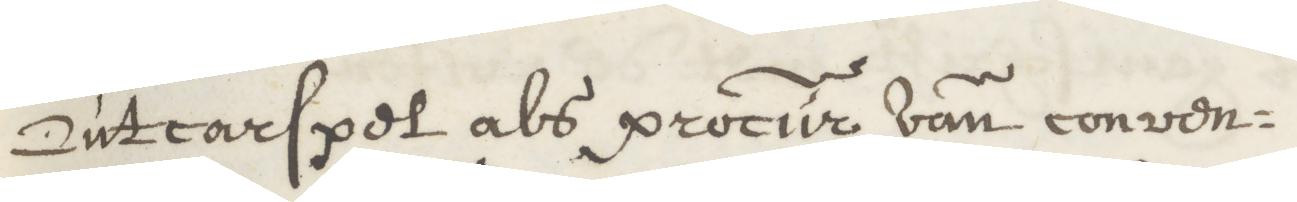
Outcarspel als procur van conven=
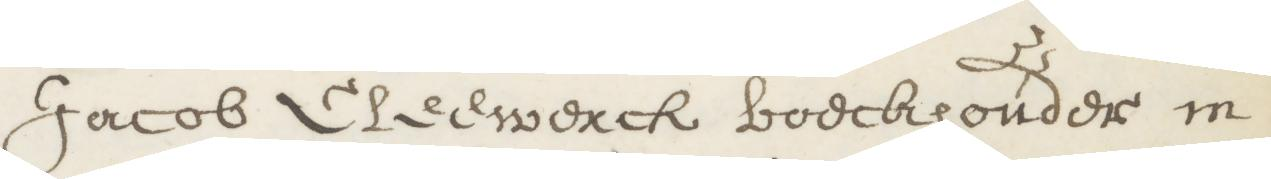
Jacob Cleewerck boeckhouder in
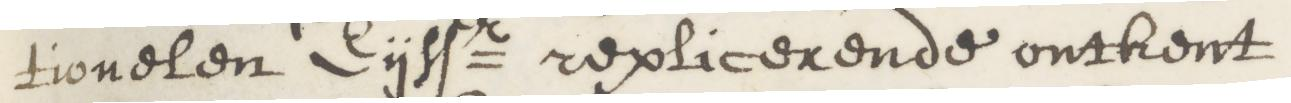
tionelen Eijss=r replicerende ontkent
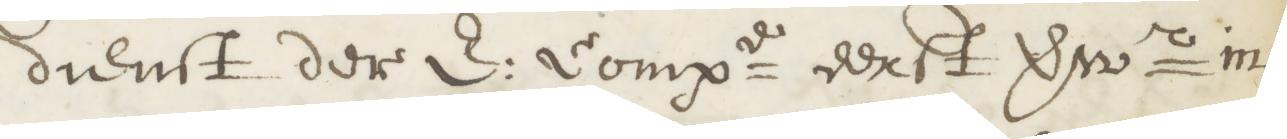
dienst der E: Comp=e eerst: verw=r in
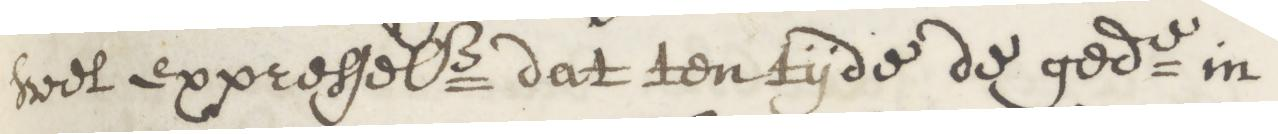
wel expressel= dat ten tijde de ged=e in
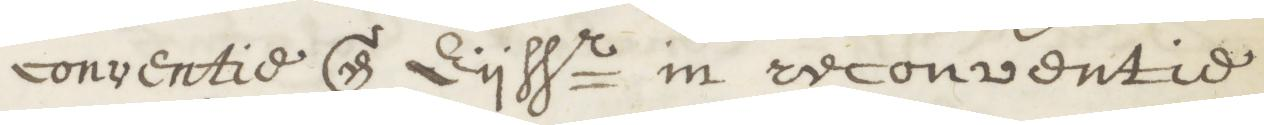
conventie ende Eijss=r in reconventie
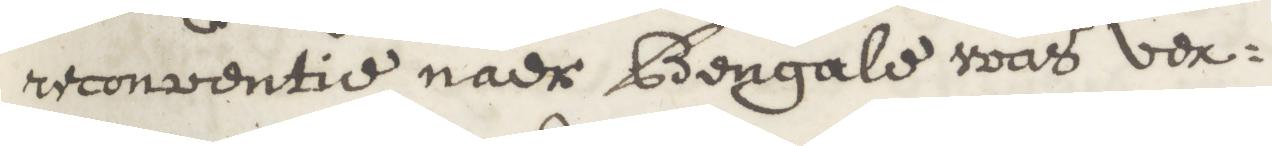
reconventie naer Bengale was ver=
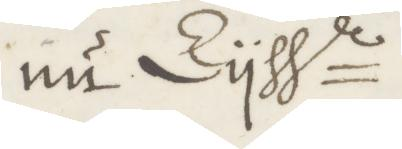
nu Eijss=r
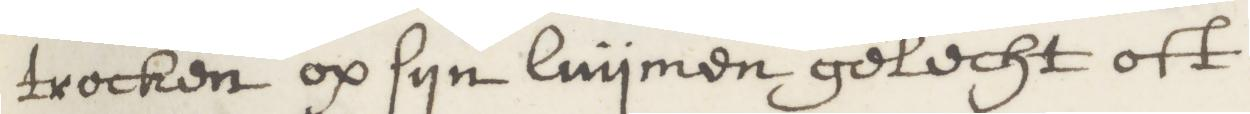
trocken op syn luijmen gelecht oft
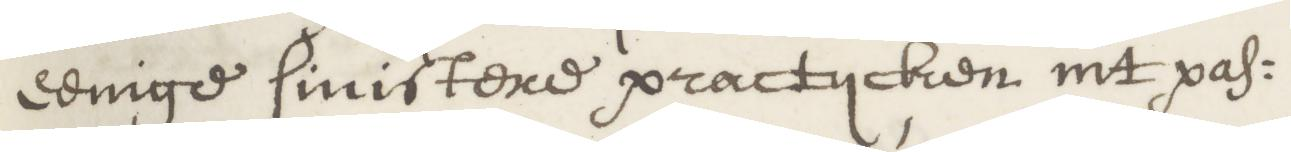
eenige sinistere practycken int pas:
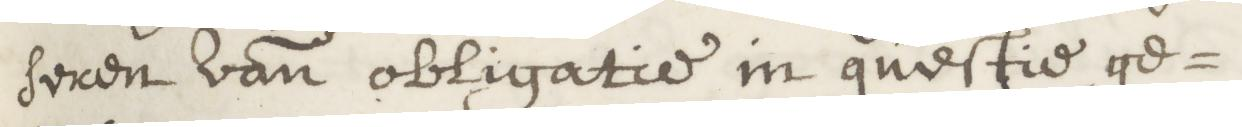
seren van obligatie in questie ge=
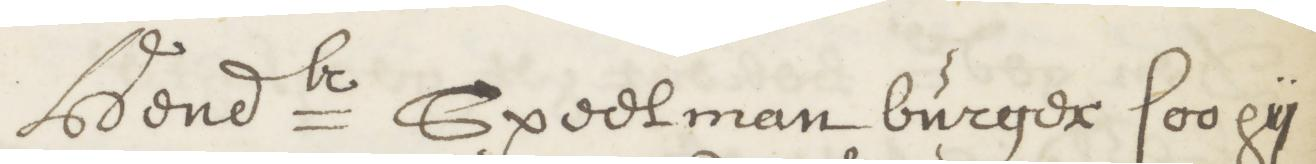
Hend=k Speelman burger soo hij
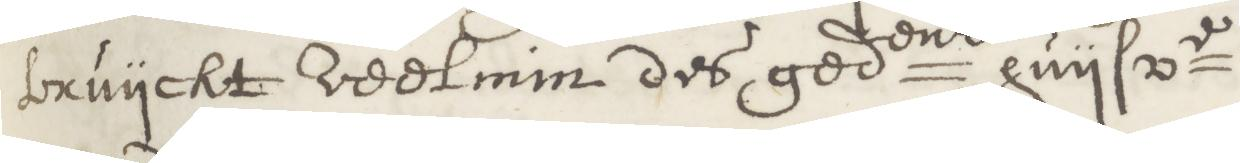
bruijckt veelmin des ged=ens huijsv=e
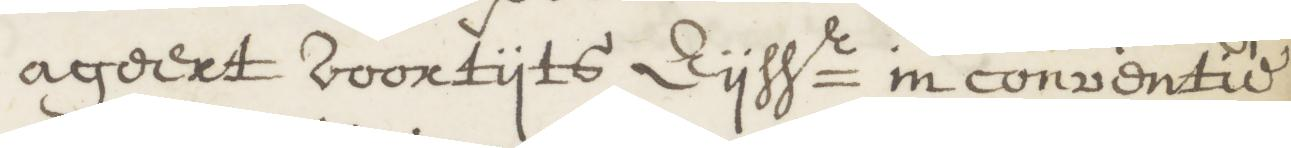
ageert voortijts Eijss=r in conventie
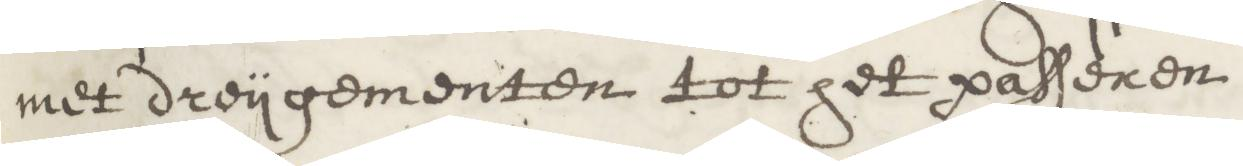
met dreijgementen tot het passeren
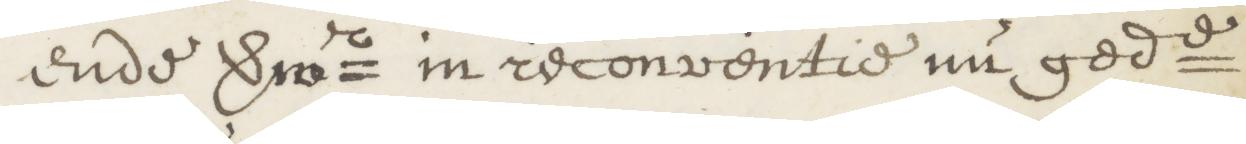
ende verw=r in reconventie nu ged=e
